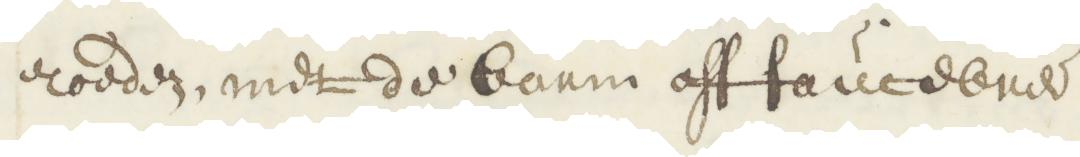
roeden, met de barm off faucebre
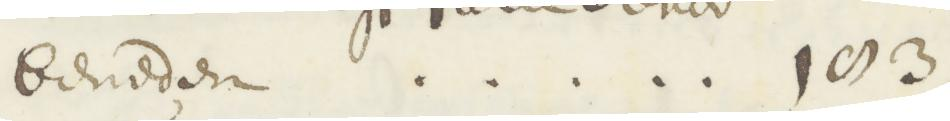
beneden . . . . . 183
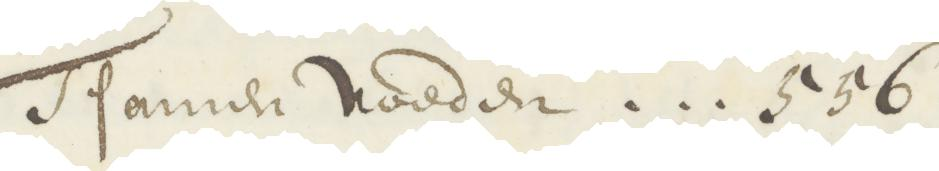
Tsamen roeden . . . 556
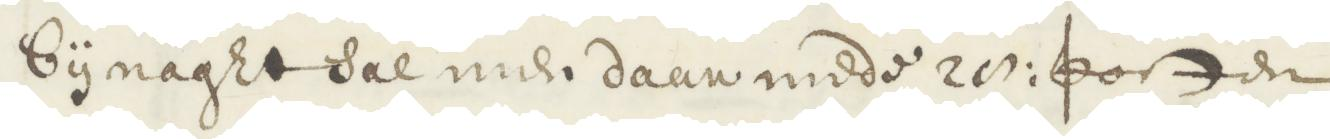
bij naght sal men daar mede 28: posten
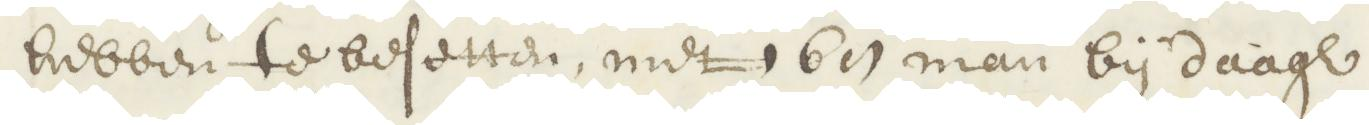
hebben te besetten, met 168 man bij daagh
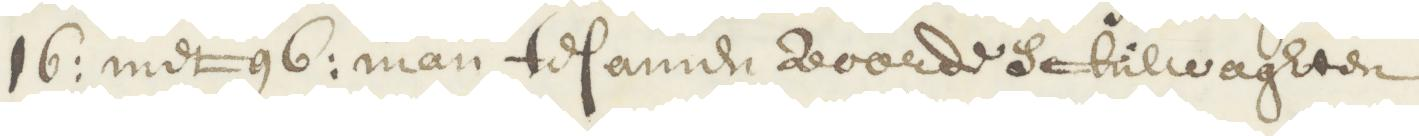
16: met 96: man tesamen voor de schilwaghten
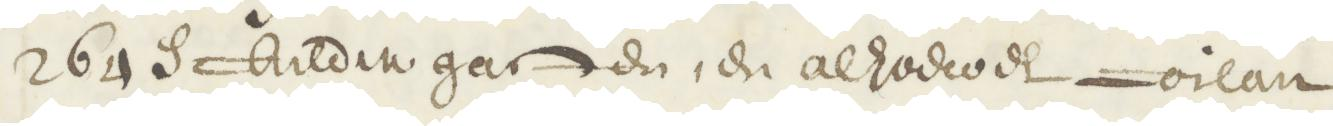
264 schilder gasten, en alhoewel coilan
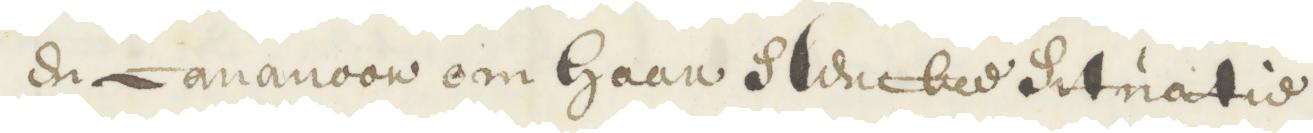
en cananoor om haar stercke situatie
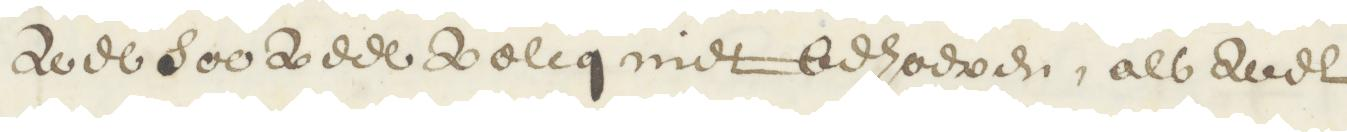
wel soo veel volcq niet behoeven, als wel
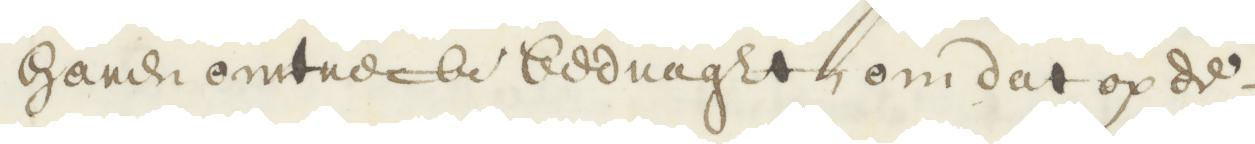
haren omtreck bedraght, om dat op de
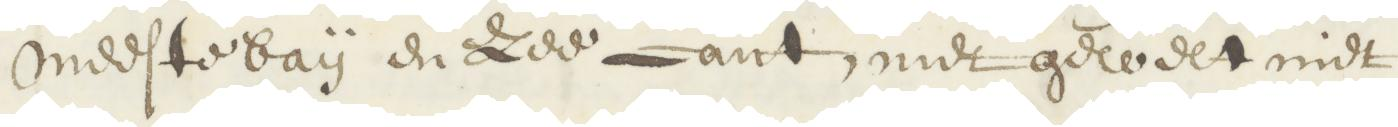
meeste baij en zee cant, met gewelt niet
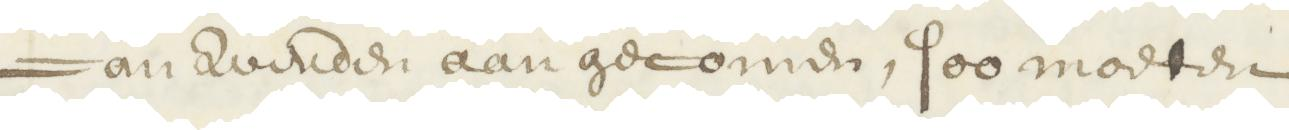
can werden aan gecomen, soo moeten
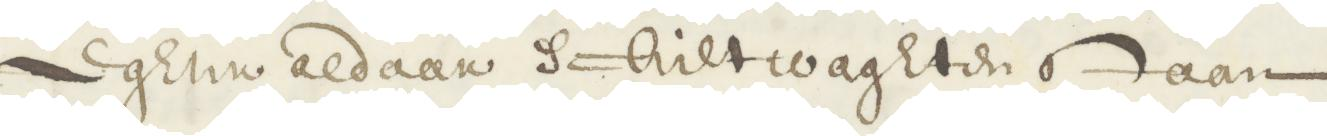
Eghter aldaar schiltwaghten staan
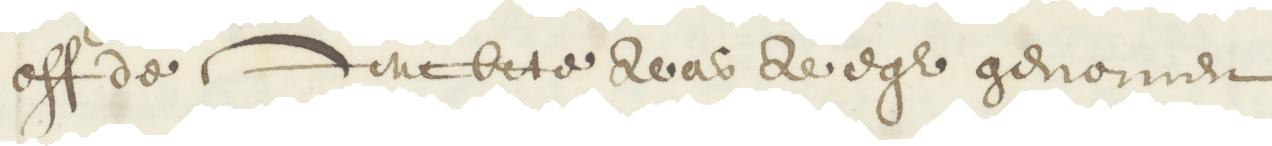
off de sterckte was wegh genomen
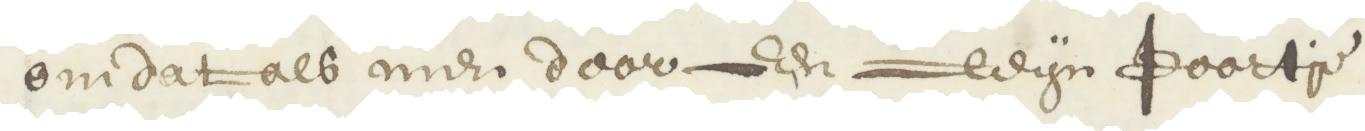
om dat als men door en cleijn poortje
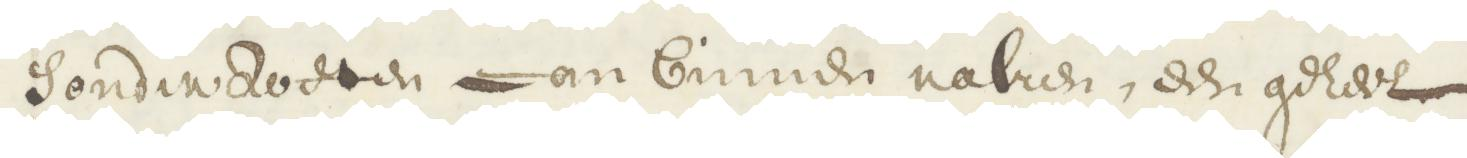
sonder weten can binnen raken, een geheel
